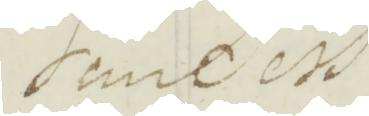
Jan Pess
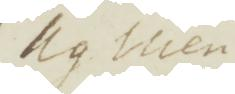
Agttien
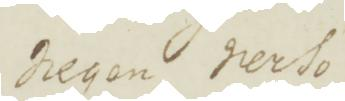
negen verso
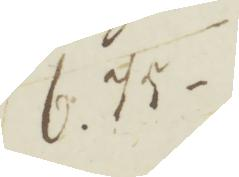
6. 75 –
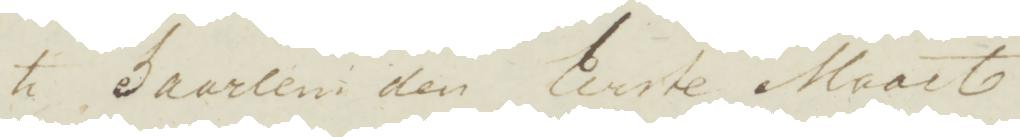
te Haarlem den Eerste Maart
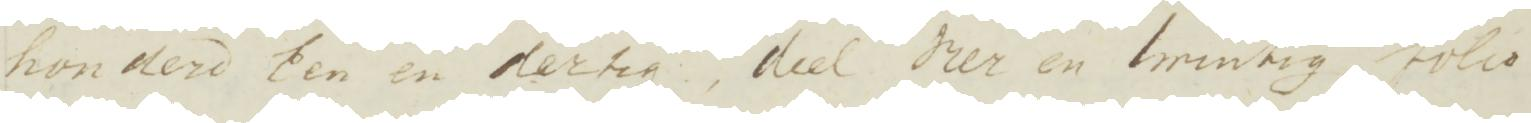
honderd Een en dertig, deel vier en twintig folio
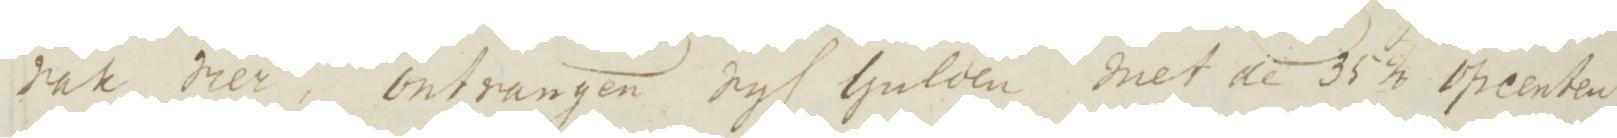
vak vier, ontvangen vijf Gulden met de 35% opcenten
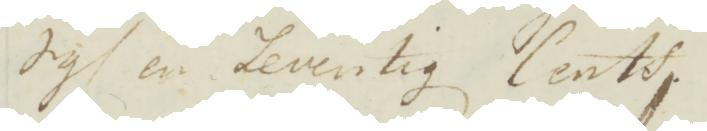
vijf en zeventig Cents.
